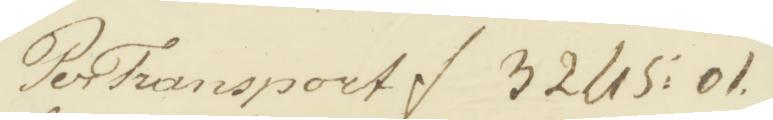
Per Transport. ƒ 3245: 01.
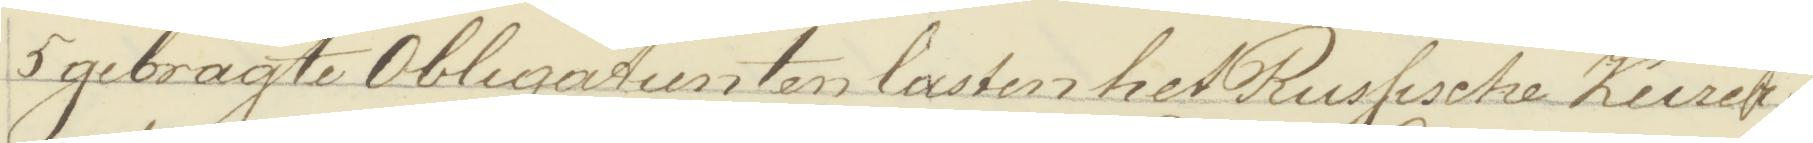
5 gebragte Obligatien ten lasten het Russische Keizer.
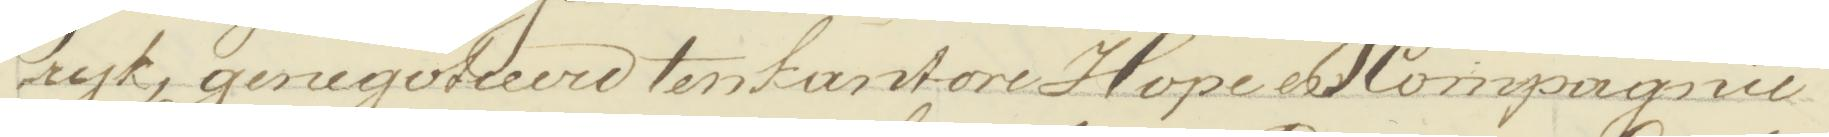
ryk, genegotieerd ten kantore Hope en Compagnie
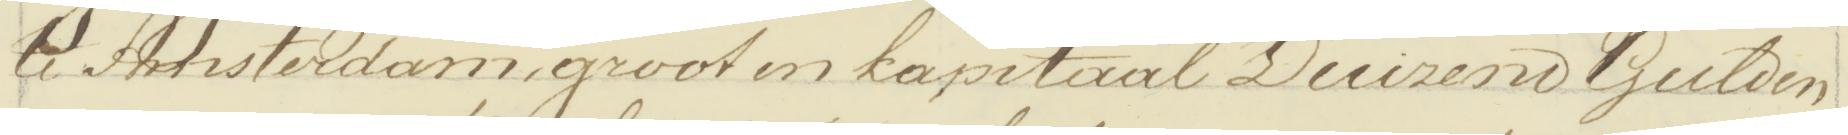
te Amsterdam, groot in kapitaal Duizend Gulden,
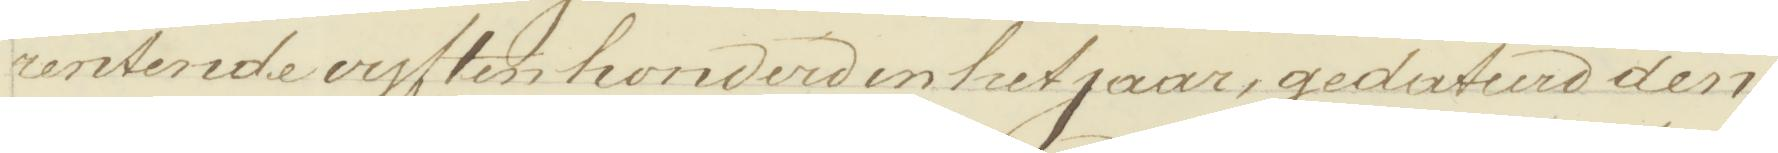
rentende vyf ten honderd in het jaar, gedateerd den
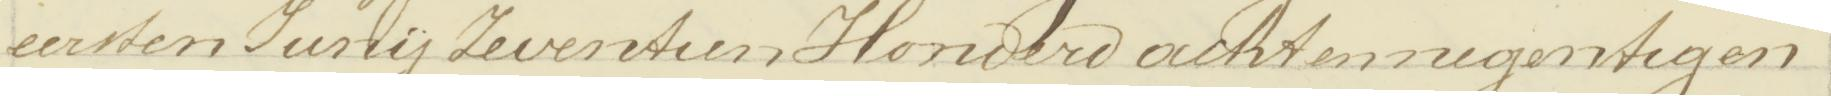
eersten Iunij Zeventien Honderd achten negentig en
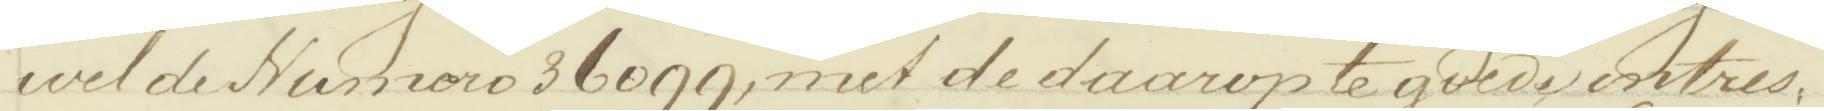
wel de Numero 36099, met de daarop te goede intres„
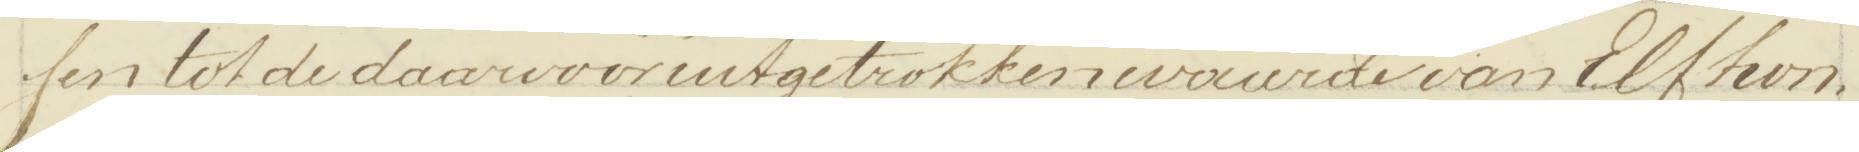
sen tot de daarvoor uitgetrokken waarde van Elfhon„
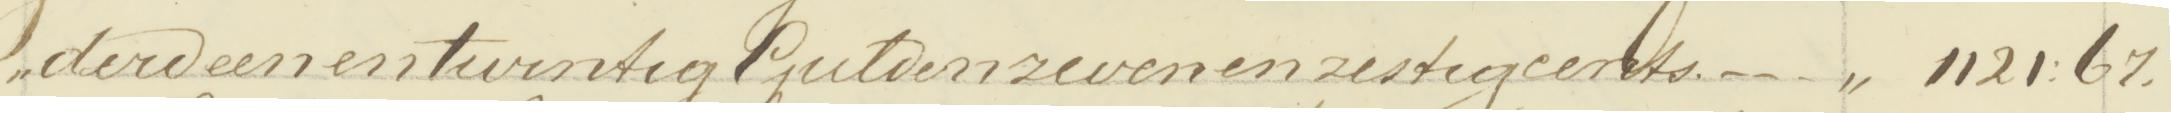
„derd een en twintig Gulden zeven en zestig cents.- - - „ 1121:67.
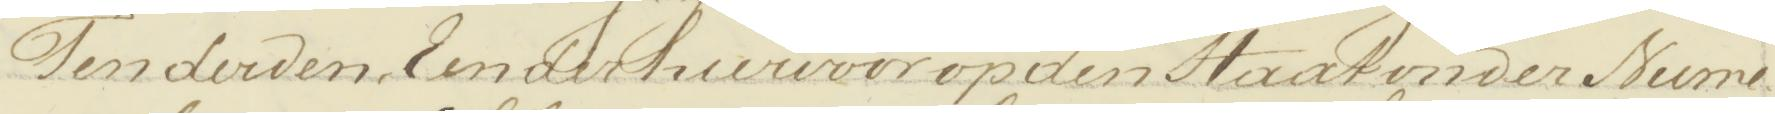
Ten derden, Een der hiervoor op den Staat onder Nume
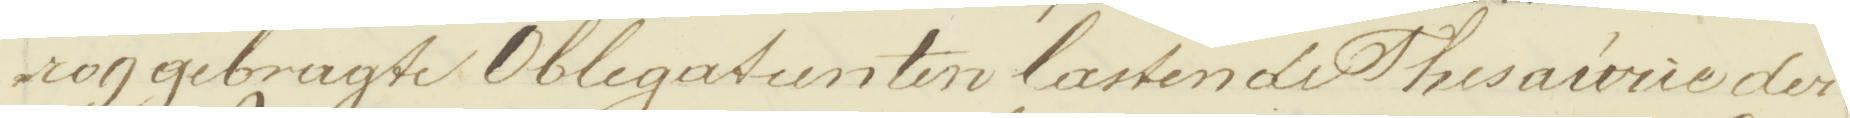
ro 9 gebragte Oblegatien ten lasten de Thesaurie der
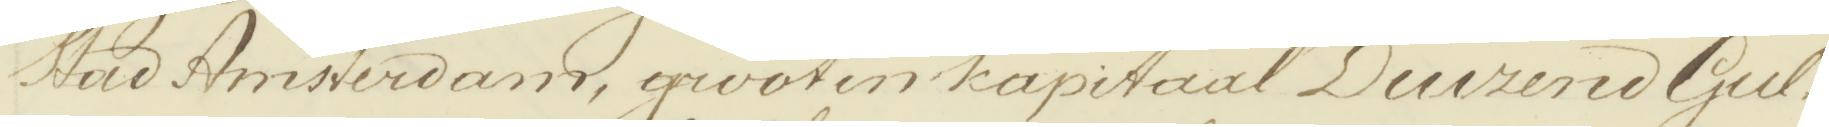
stad Amsterdam, groot in kapitaal Duizend Gul.
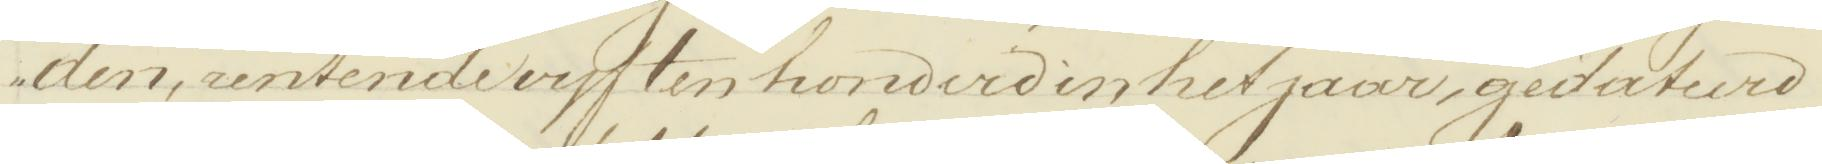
„den, rentende vyf ten honderd in het jaar, gedateerd
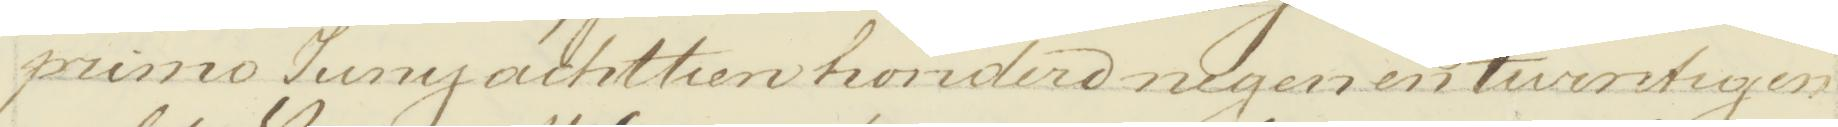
primo Iuny achttien honderd negen en twintig en
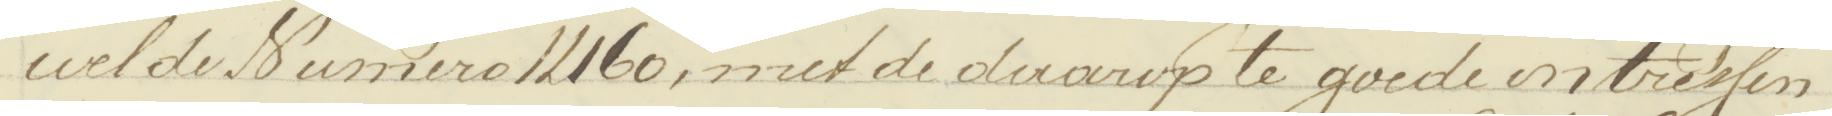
wel de Numero 1460, met de daarop te goede intressen
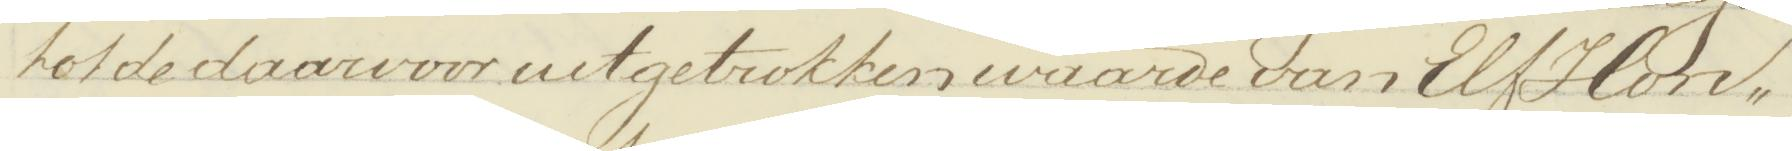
tot de daarvoor uitgetrokken waarde van Elf Hon„
